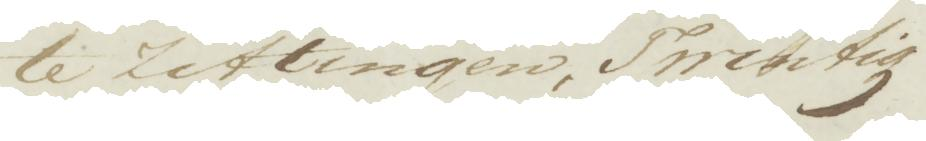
te zittingen, Twintig
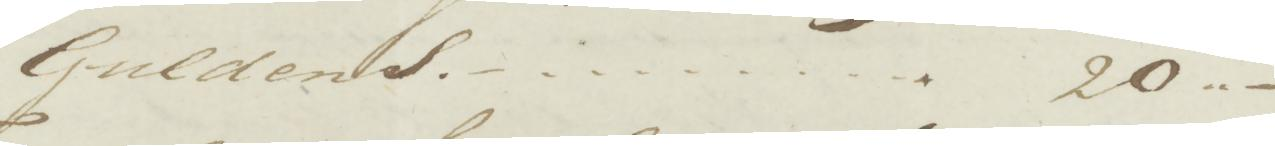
Guldens. 20 „-
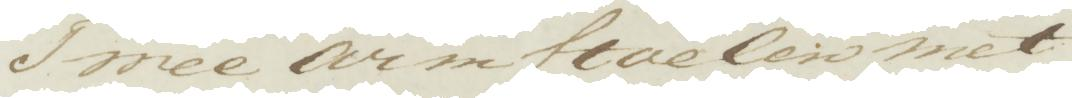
Twee armstoelen met
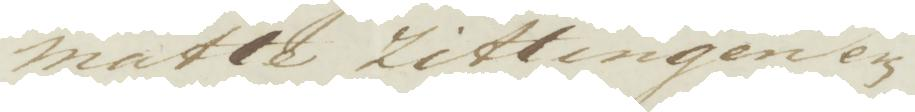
matte zittingen en
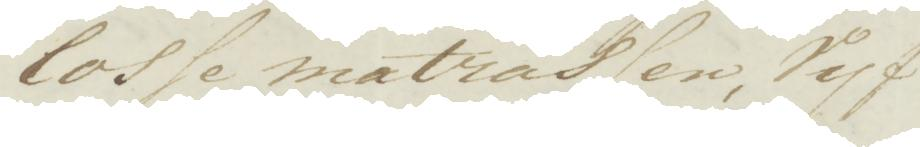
losse matrassen, Vijf
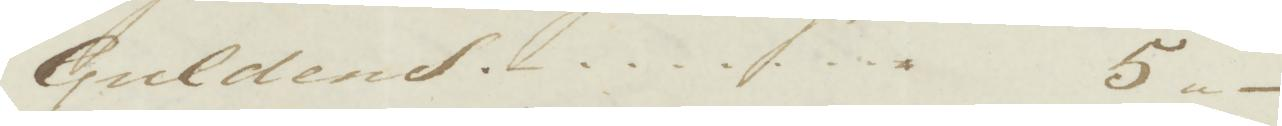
Guldens. 5 „-
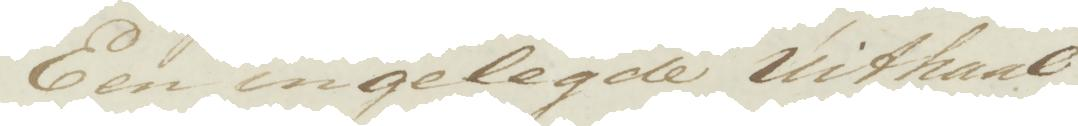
Een ingelegde uithaal
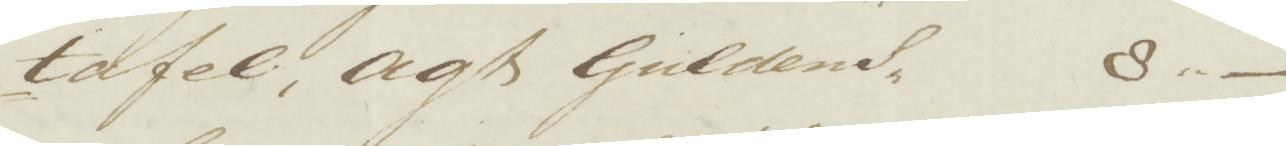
„tafel, agt Guldens„ 8 „-
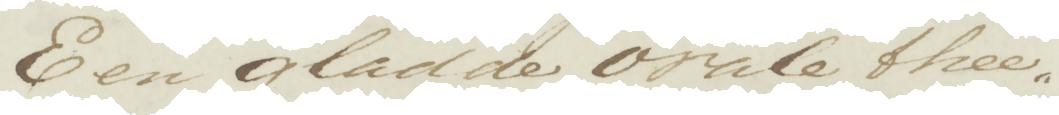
Een gladde ovale thee„
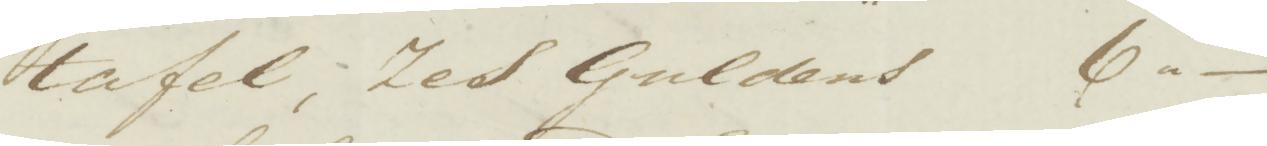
tafel, Zes Guldens 6 „-
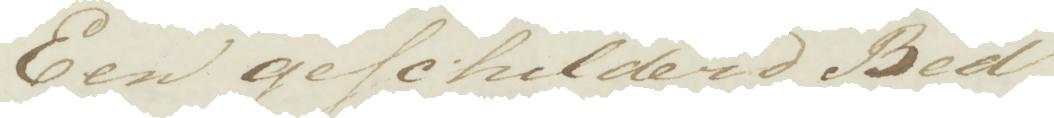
Een geschilderd Bed
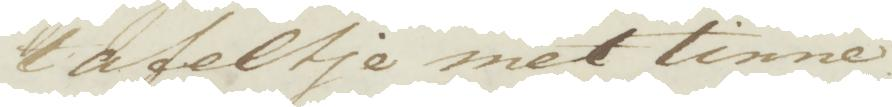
tafeltje met tinne
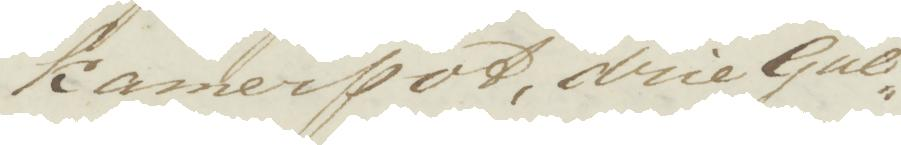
kamerpot, drie Gul„
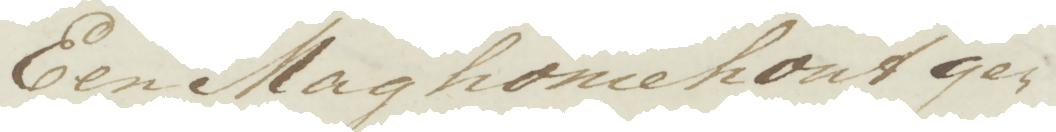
Een Mahoniehout ge
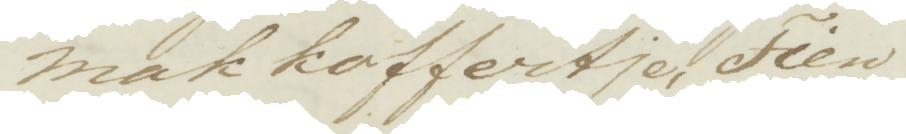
mak koffertje Tien
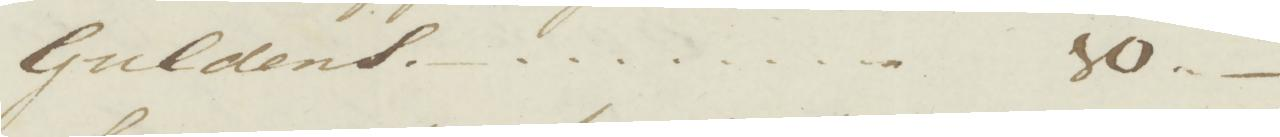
Guldens. 10 „-
